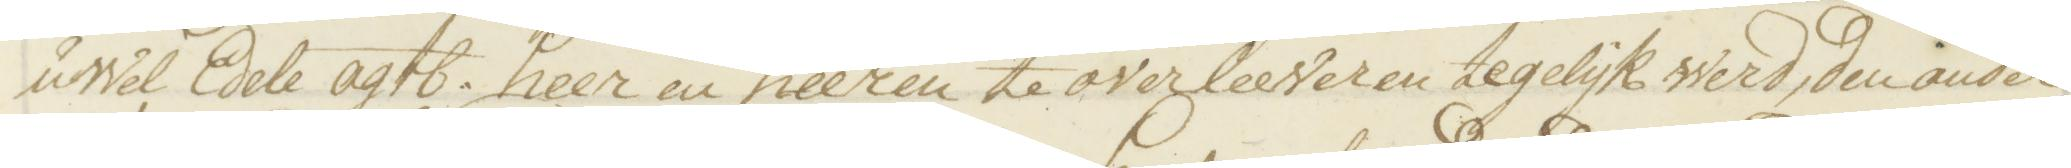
uwel Edele agtb: heer en heeren te overleeveren tegelijk werd, den onder
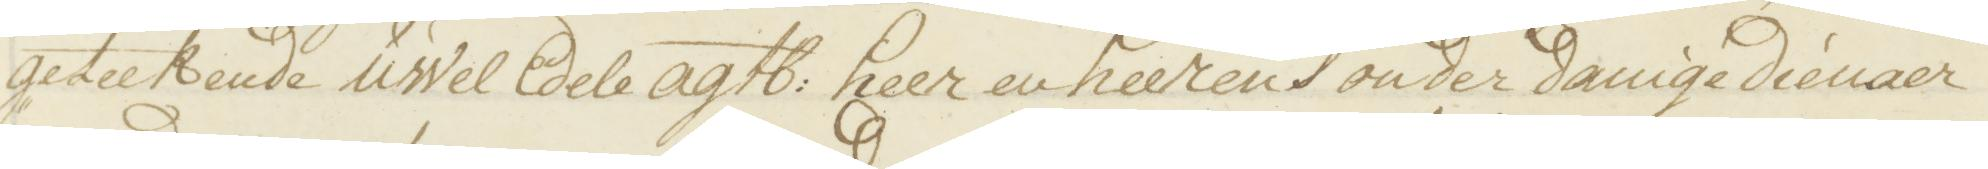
geteekende uwel Edele agtb: heer en heerens onder danige dienaer
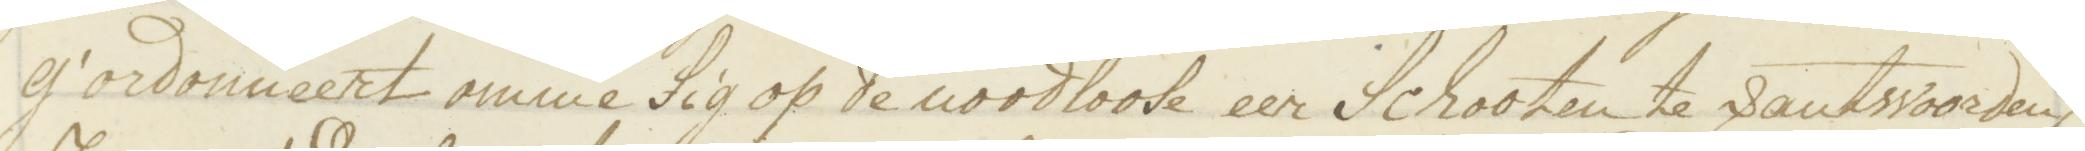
g’ordonneert omme sig op de noodloose eer schooten te verantwoorden,
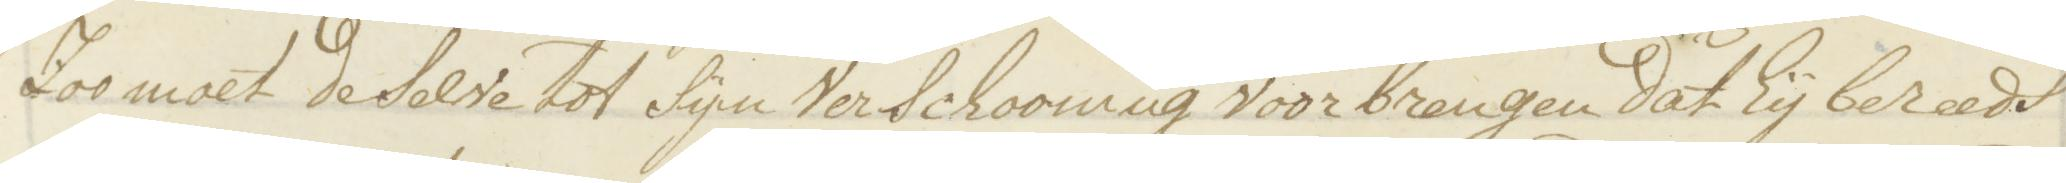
zoo moet deselve tot sijn verschooning voorbrengen dat hij bereeds
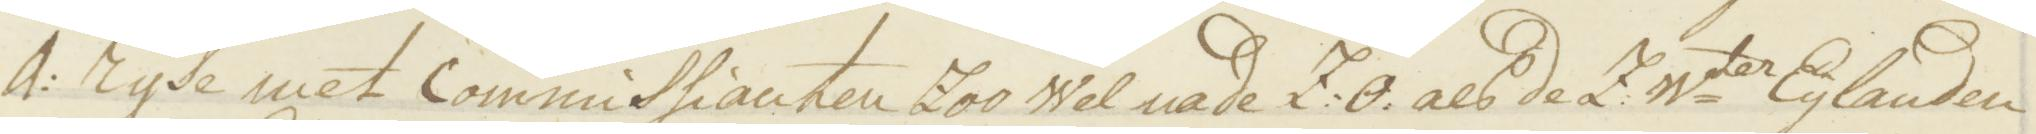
4: rijse met commissianten zoo wel nade z:o: als de z:w=ter Eijlanden
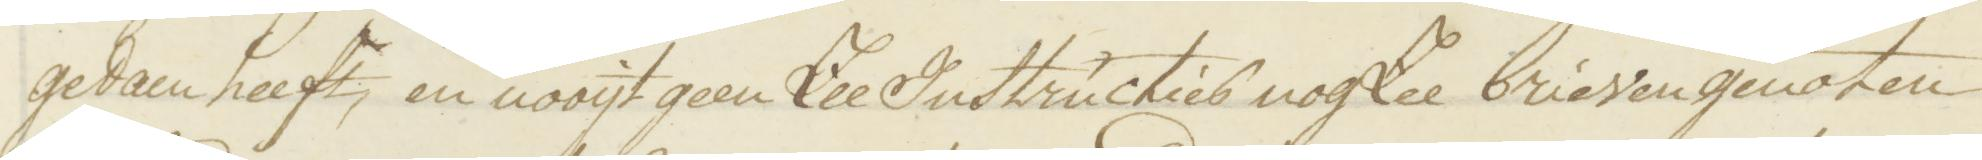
gedaen heeft, en nooijt geen zee Instructies nog zee brieven genoten
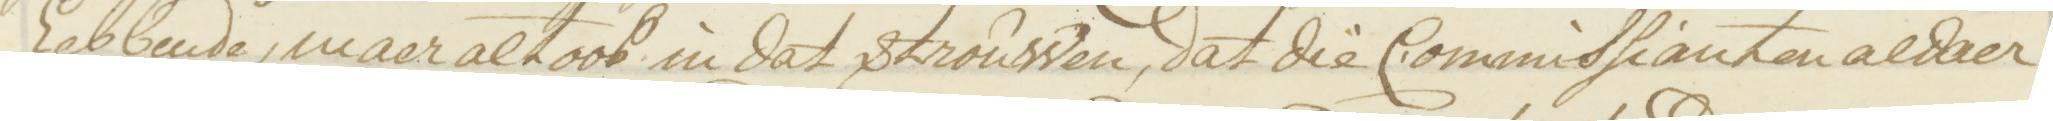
hebbende, maer altoos in dat vertrouwen, dat die Commissianten aldaer
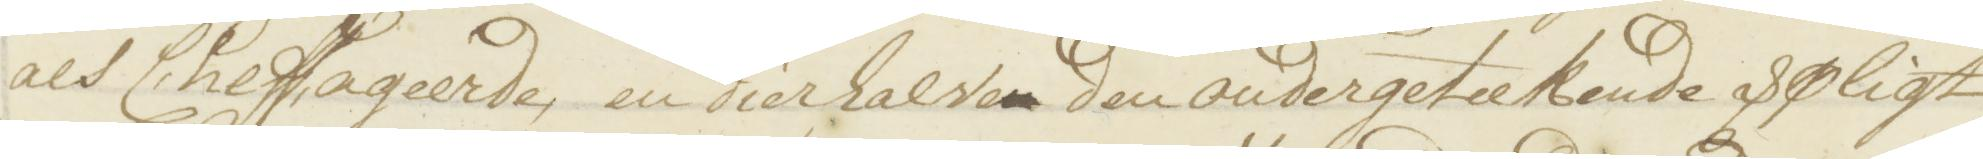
als Cheffageerde, en dierhalven den ondergeteekende verpligt
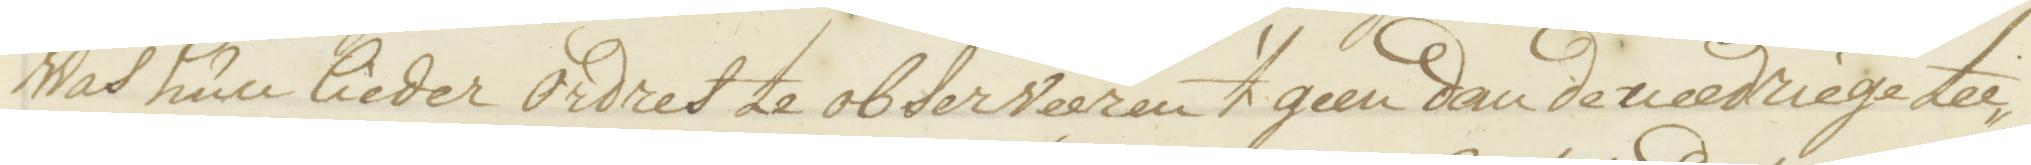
was hun lieder ordres te observeeren ’t geen dan de needriege tee„
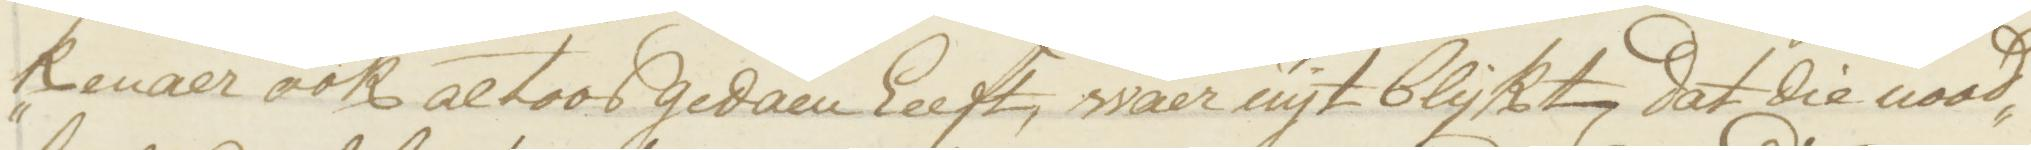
kenaer ook altoos gedaen heeft, waer uijt blijkt, dat die nood„
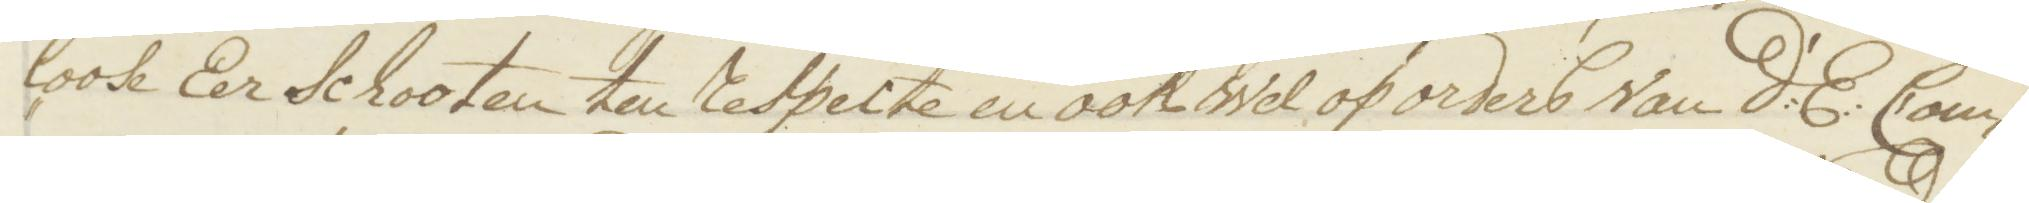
loose Eer schooten ten respecte en ook wel op orders van d':E: Com„
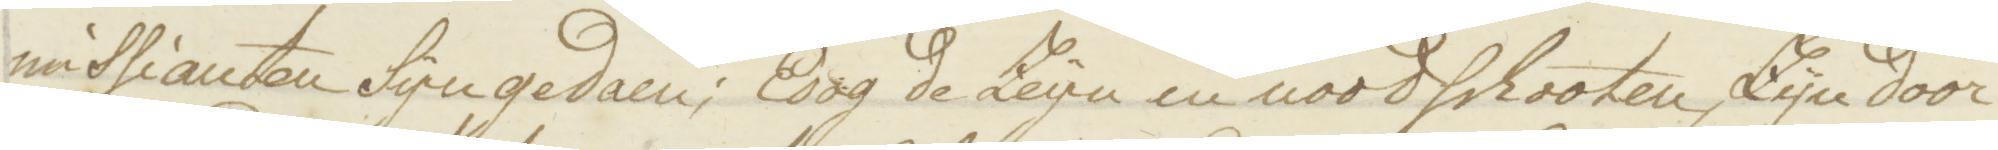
missianten sijn gedaen; Edog de zeijn en noodschooten, zijn door
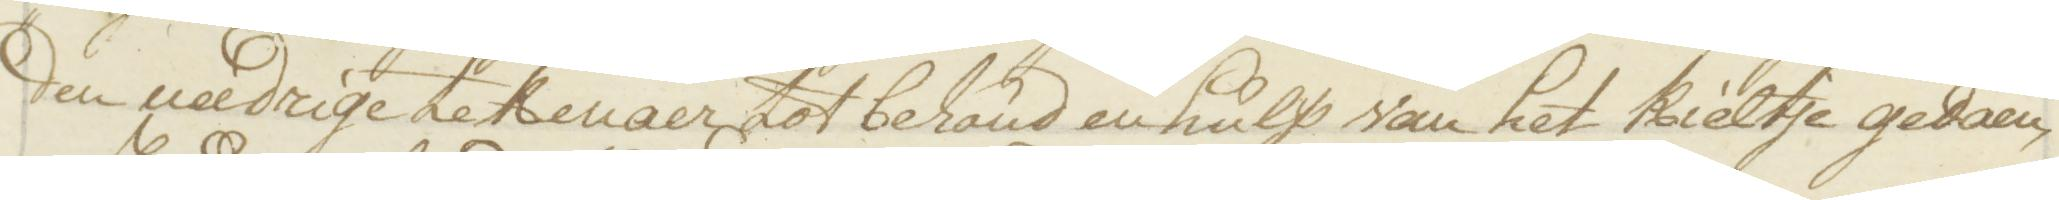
den needrige tekenaer tot behoud en hulp van het kieltje gedaen
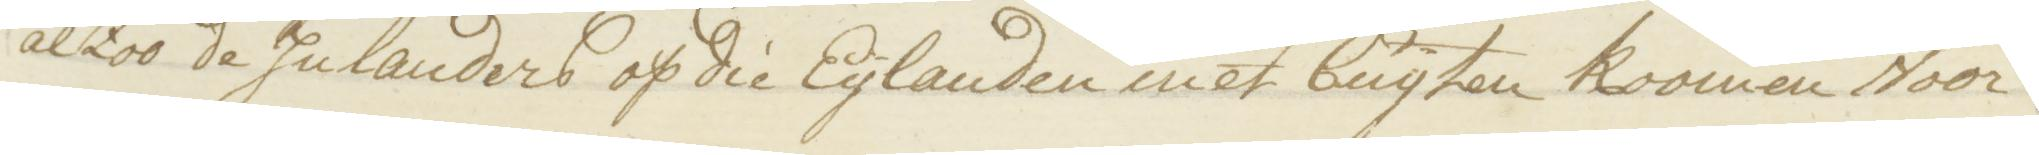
alzoo de Jnlanders op die Eijlanden niet buijten koomen voor
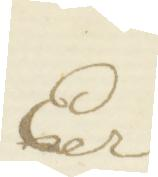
Eer
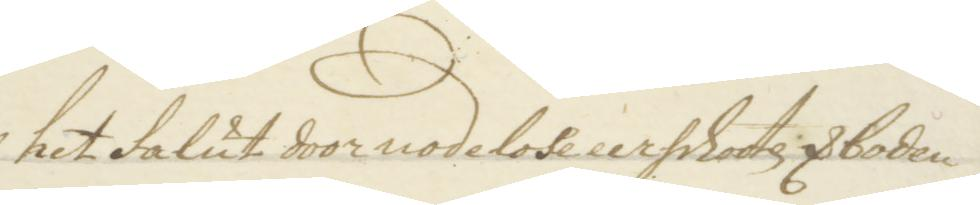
het salut door nodelose eerschooten verboden
